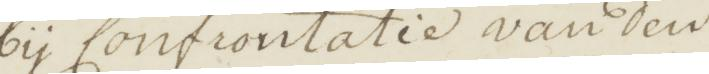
bij Confrontatie van den
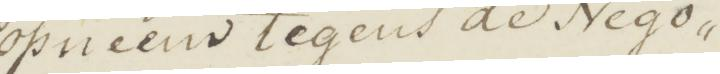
opneem tegens de Nego„
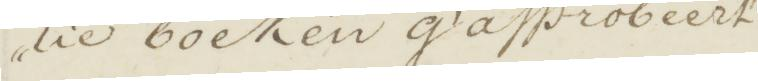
„tie boeken g’approbeert
